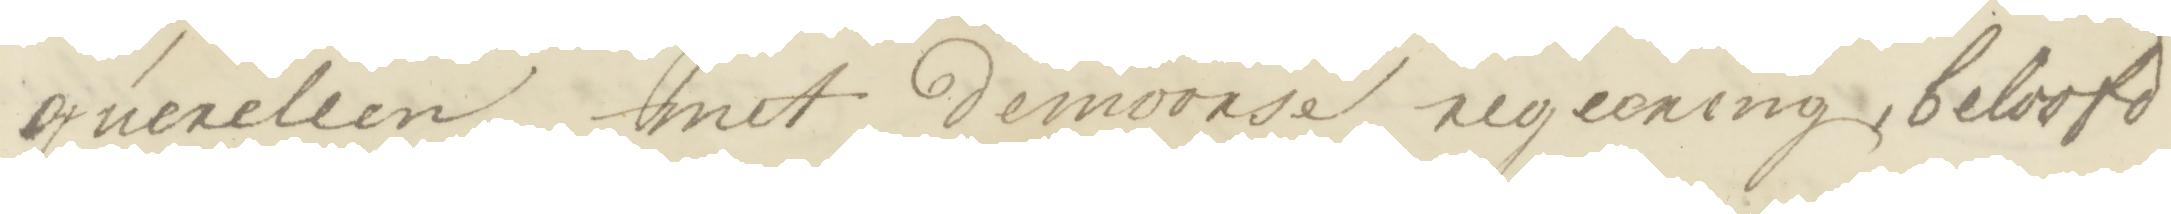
querellen met demoorse regeering, beloofd
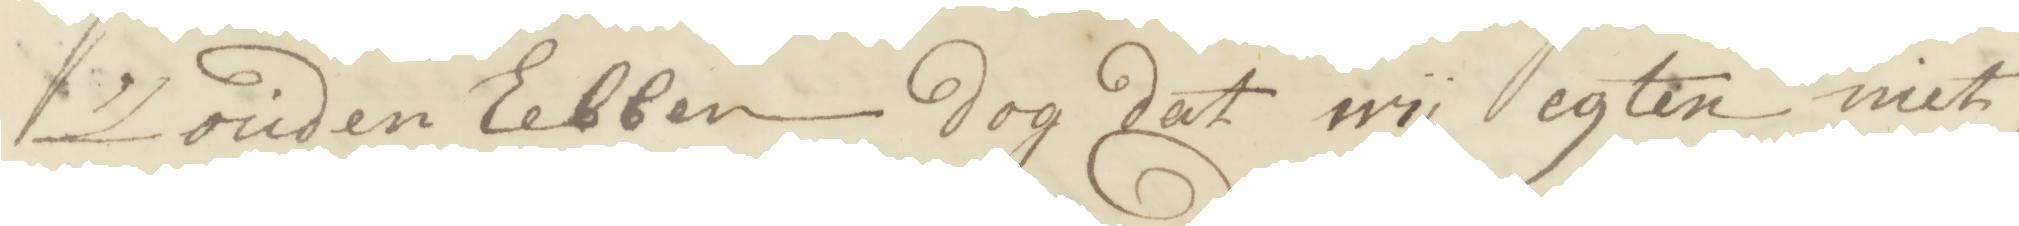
zouden hebben dog dat wij egter niet
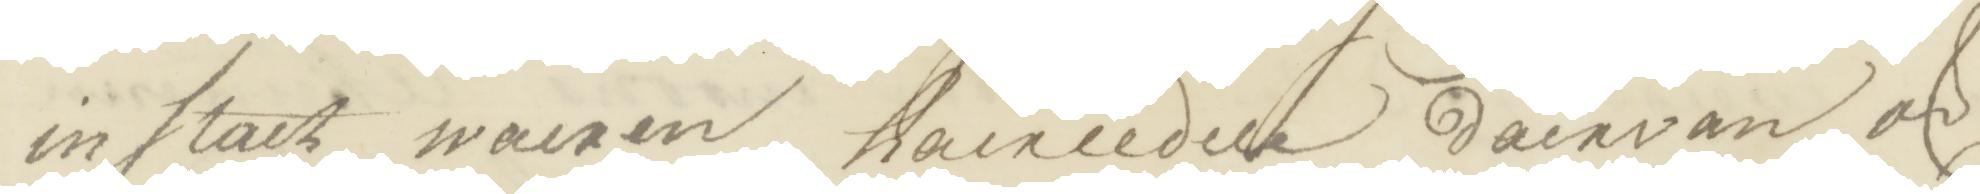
in staet waeren haer eedele daervan over
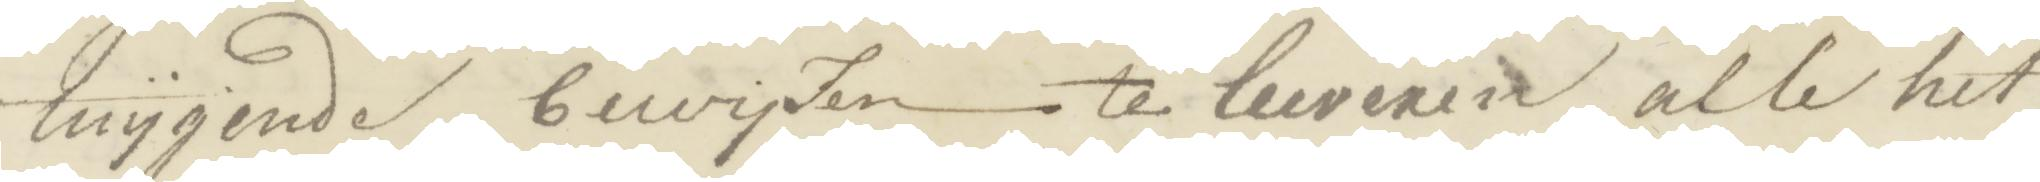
tuijgende bewijsen te leeveren alle het
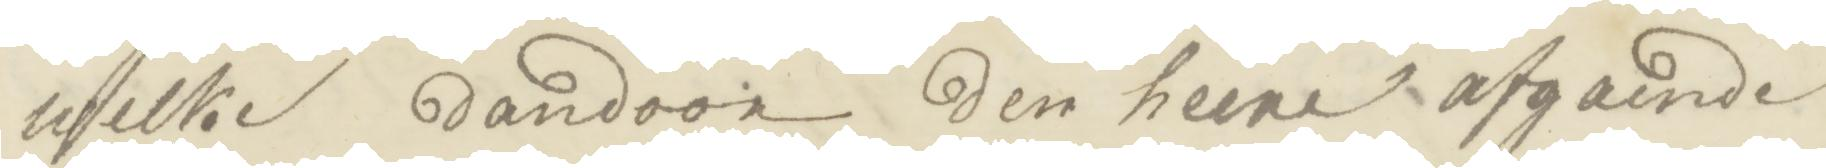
welke dandoor den heere afgaende
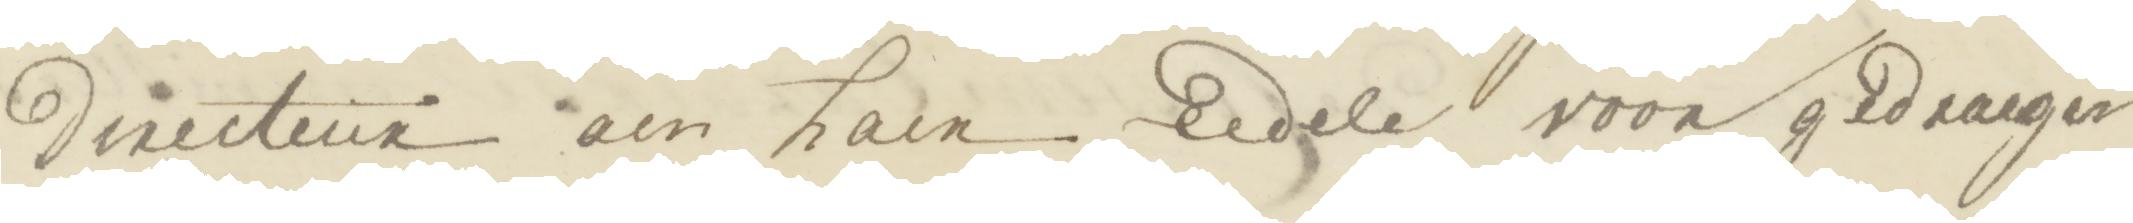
directeur aen hair Eedele voor gedraegen
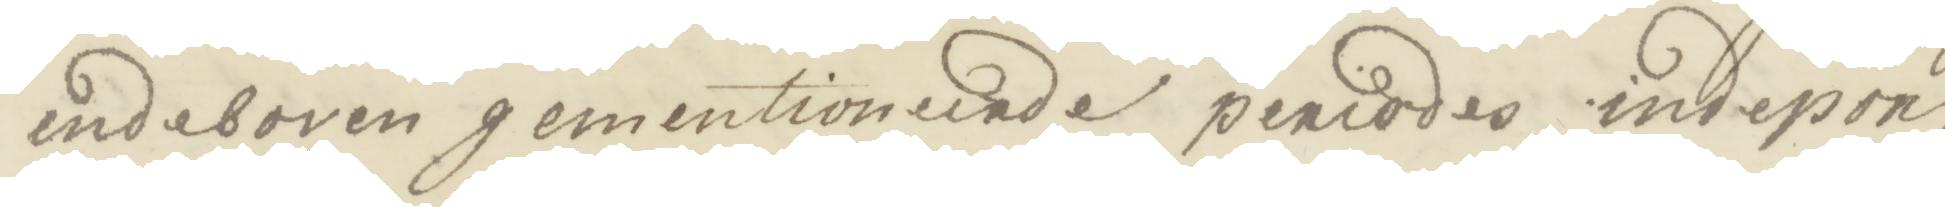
ende boven gementioneerde periodes indepor
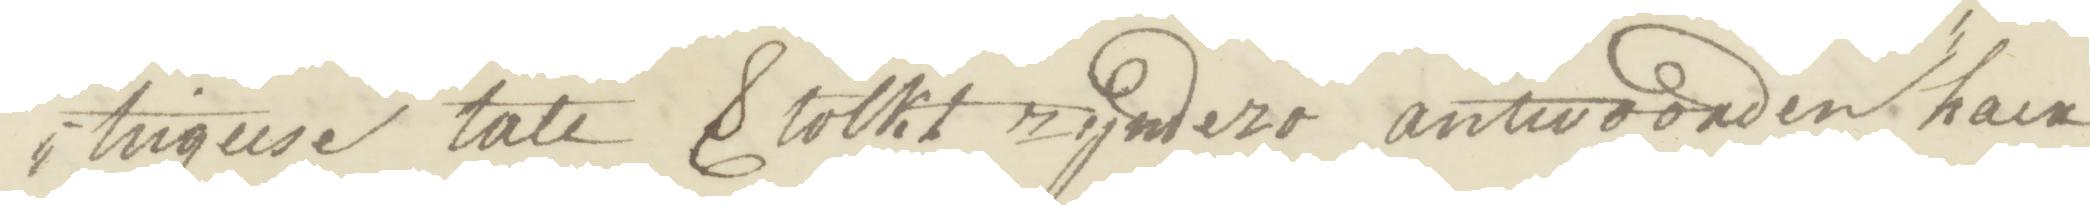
„tugeese tale vertolkt zijndeze antwoorden haer
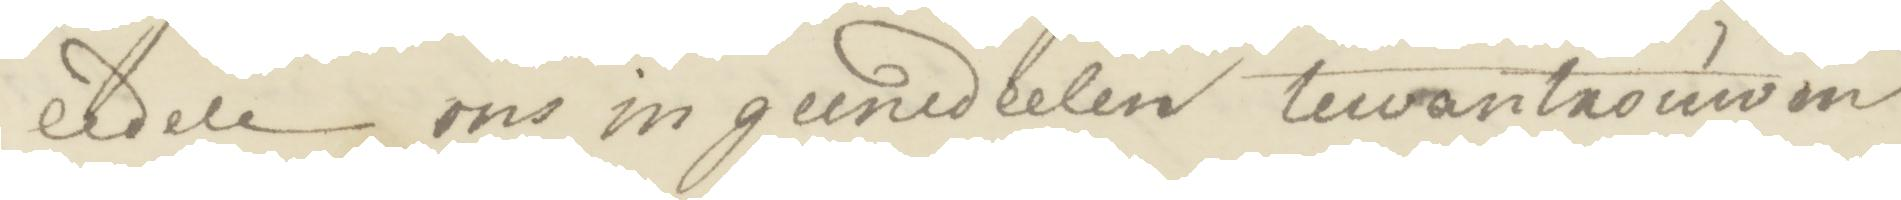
Eedele ons in geenedeelen tewantrouwen
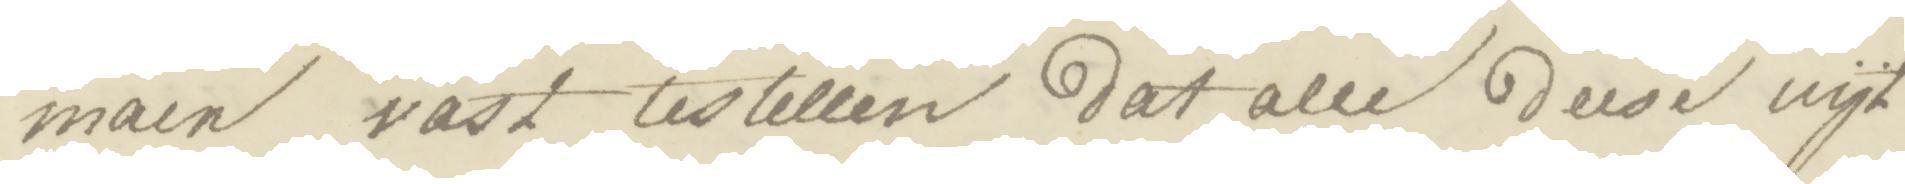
maer vast testellen dat alle deese uijt
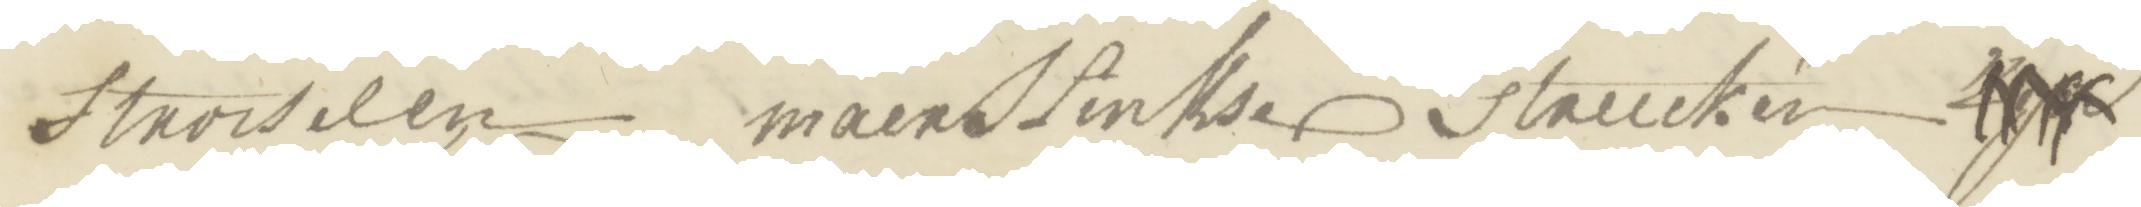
stroiselen maerslinkse streecken
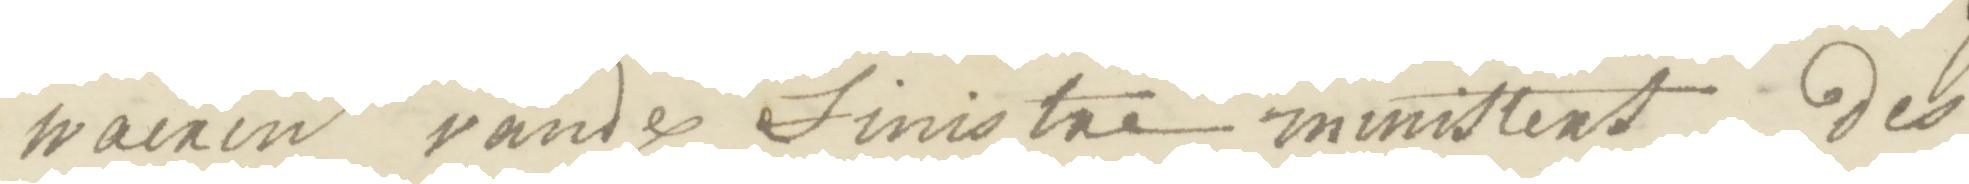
waeren vande Sinistre ministers des
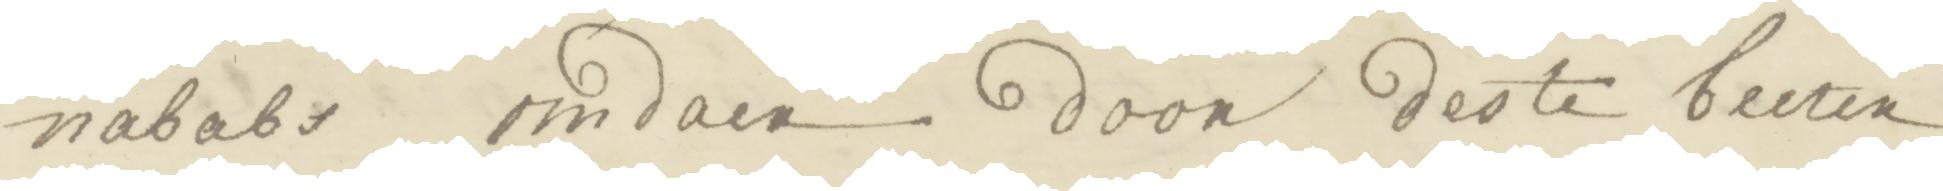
nababs omdaer door des te beeter
